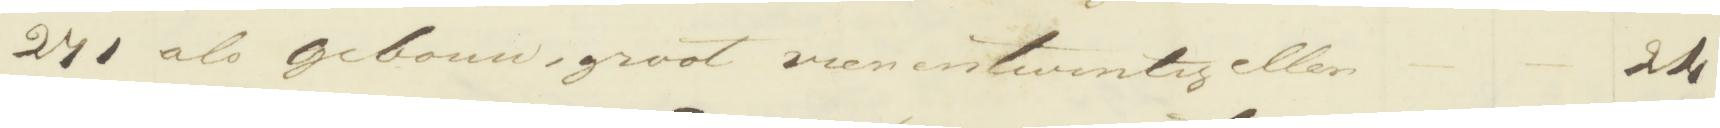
271 als gebouw, groot vier entwintig ellen — — 24
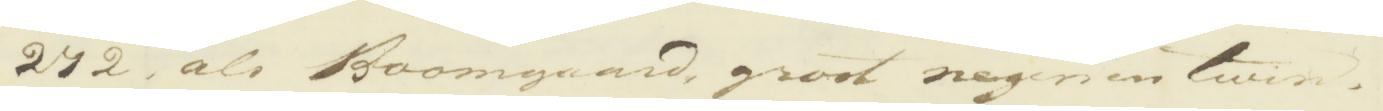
272, als Boomgaard, groot negen en twin„
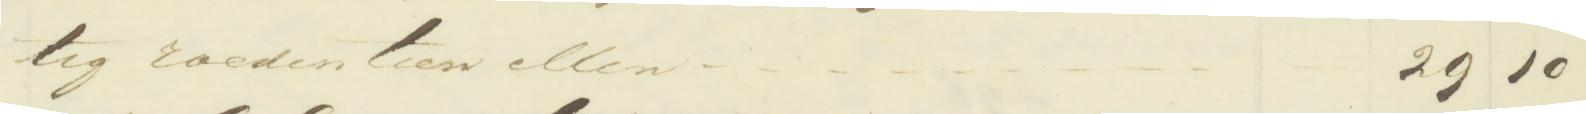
tig roeden tien ellen - - - - - - - - - - — 29 10
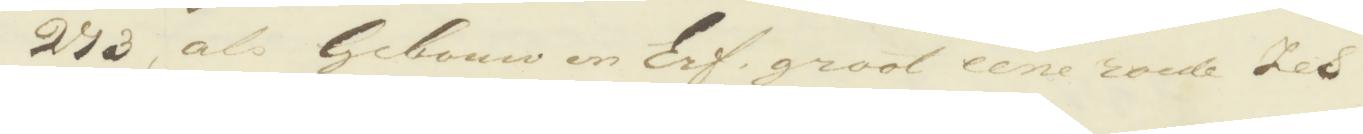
273, als Gebouw en Erf, groot eene roede zes
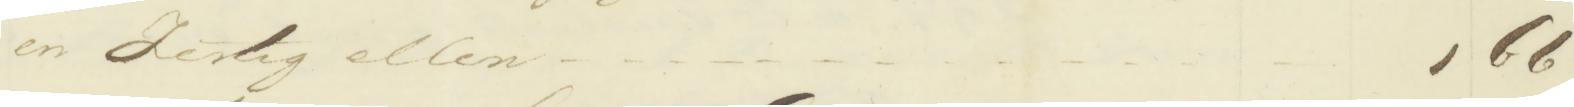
en Zestig ellen - - - - - - - - - - - - — 1 66
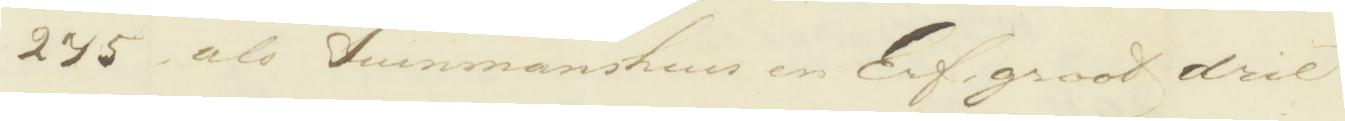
275, als Tuinmanshuis en Erf, groot drie
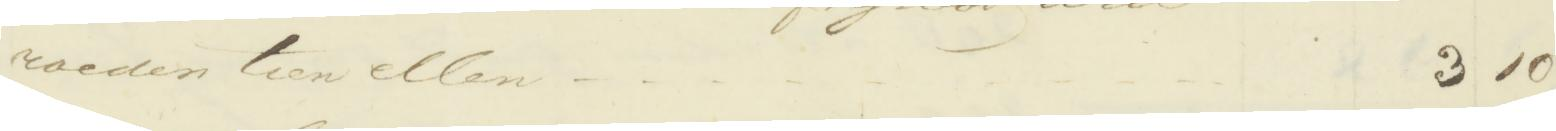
roeden tien ellen - - - - - - - - - - 3 10
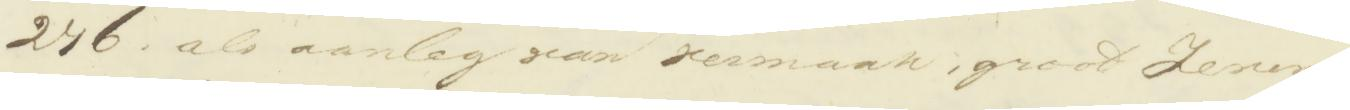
276, als aanleg van vermaak, groot Zeven
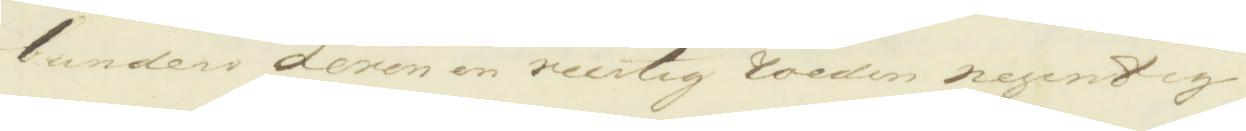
bunders Zeven en veertig roeden negentig
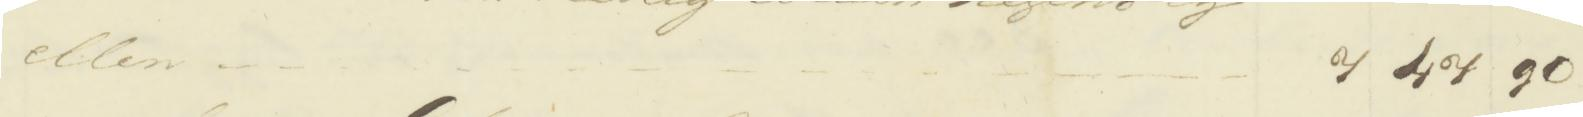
Ellen - - - - - - - - - - - - - - - - - 7 47 90
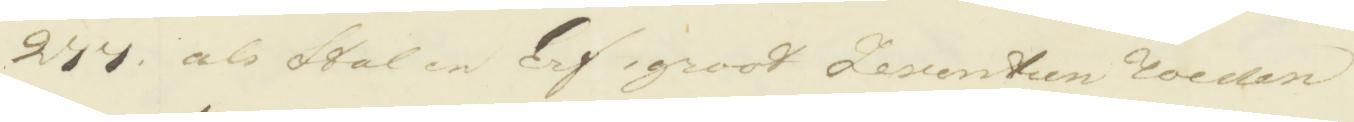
277, als stal en Erf groot Zeventien roeden
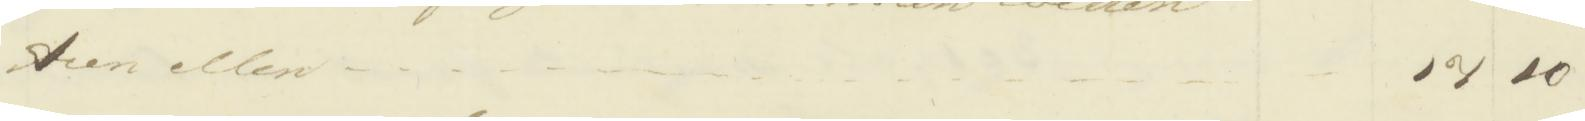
tien ellen - - - - - - - - - - - - - - - - - - — 17 10
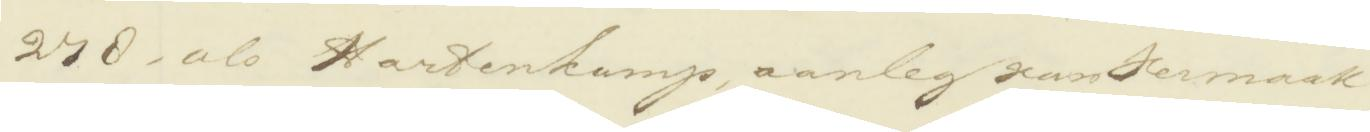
278, als Hartenkamp, aanleg van Vermaak
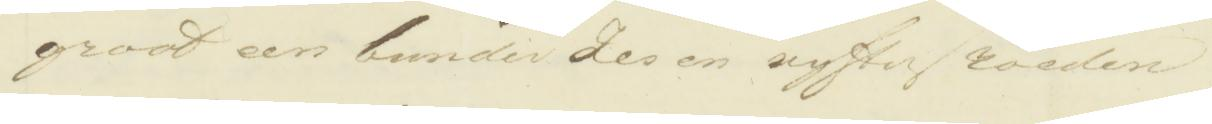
groot een bunder Zes en vyftig roeden
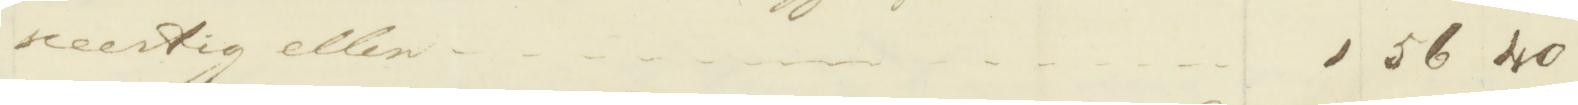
veertig ellen - - - - - - - - - - - - - - - 1 56 40
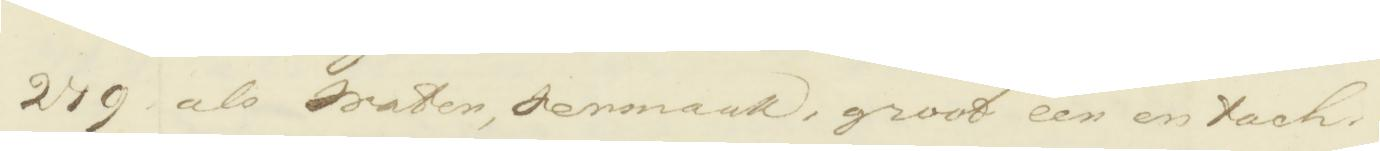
279, als Water, Vermaak, groot een en tach„
